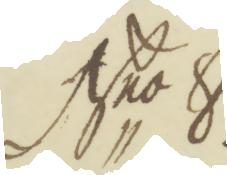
N„ro 8.
